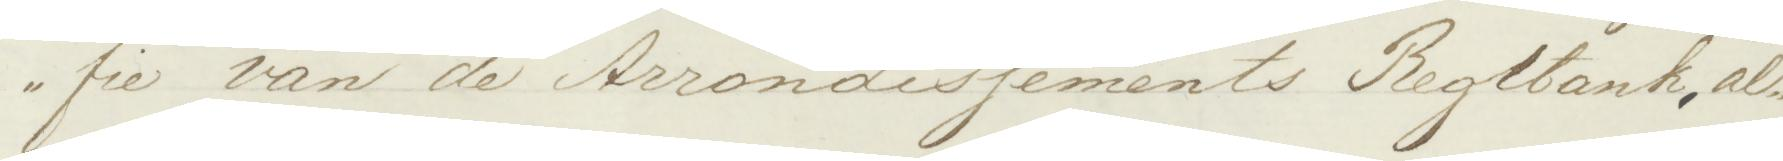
„fie van de Arrondissements Regtbank, al
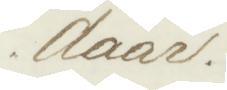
„daar.
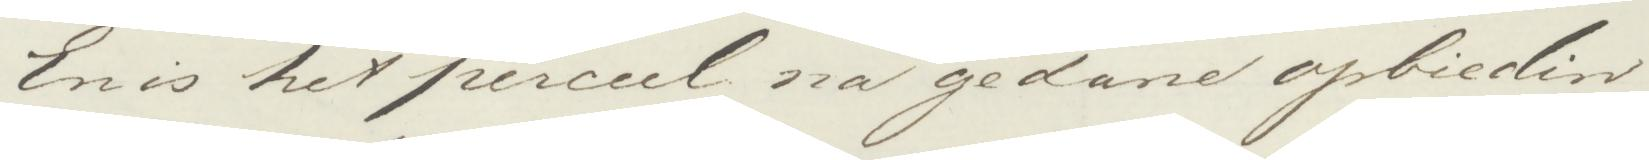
En is het perceel na gedane opbiedin
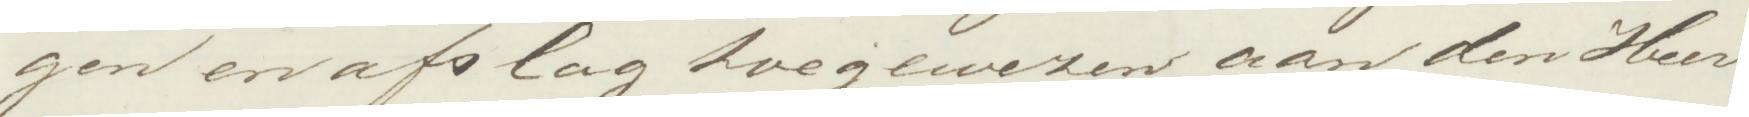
gen en afslag toegewezen aan den Heer
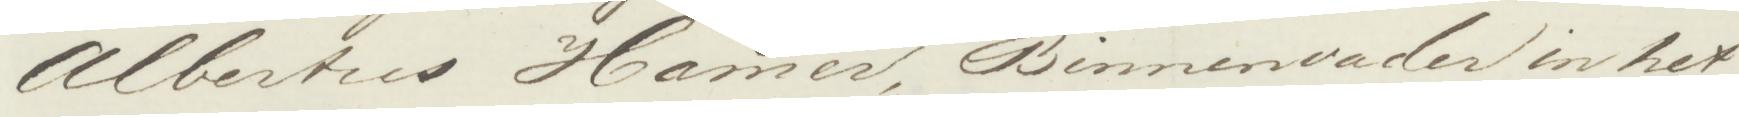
Albertus Hamer, Binnenvader in het
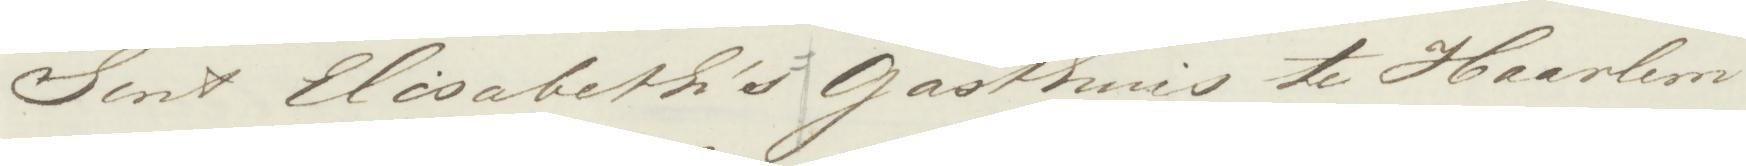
Sint Elisabeth's | Gasthuis te Haarlem
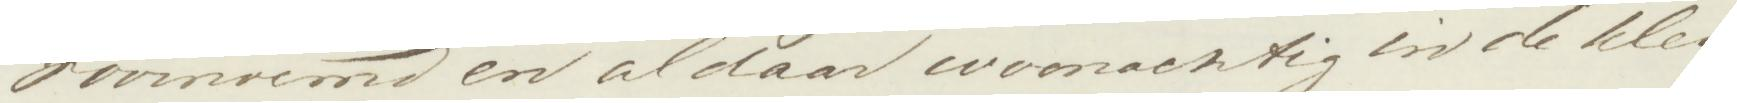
voornoemd en aldaar woonachtig in de klei
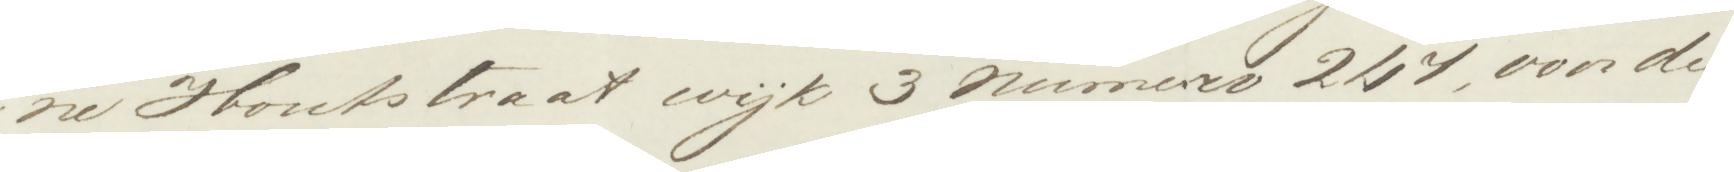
„ne Houtstraat wijk 3 numero 247, voor de
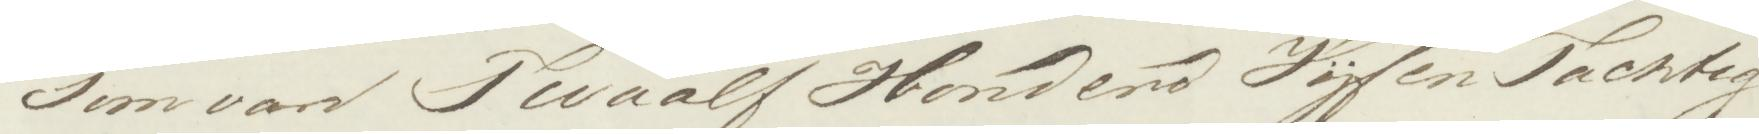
som van Twaalf Honderd Vijf en Tachtig
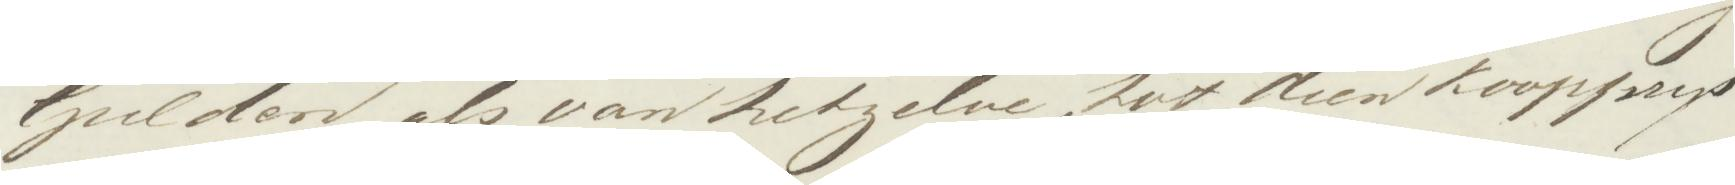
Gulden, als van hetzelve, tot dien koopprys
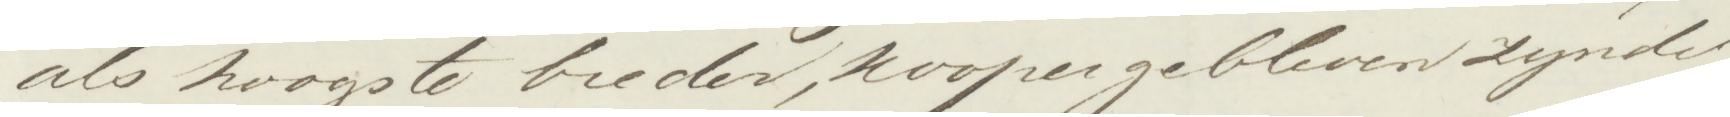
als hoogste bieder, kooper gebleven zynde,
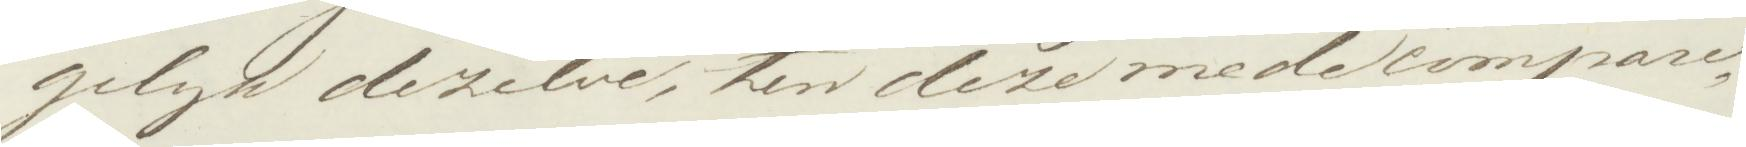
gelyk dezelve, ten deze mede compare„
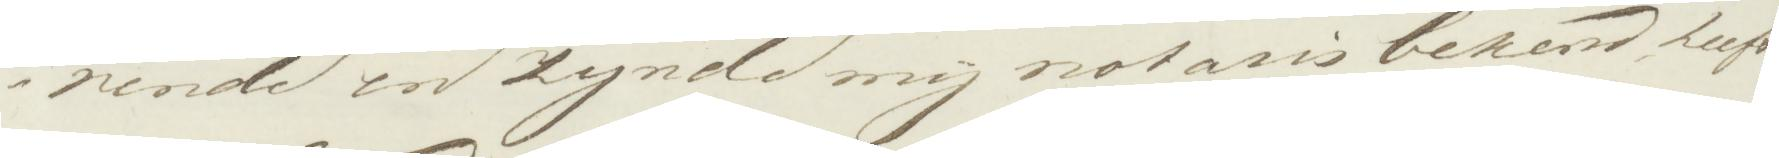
„rende en zynde mij notaris bekend heeft
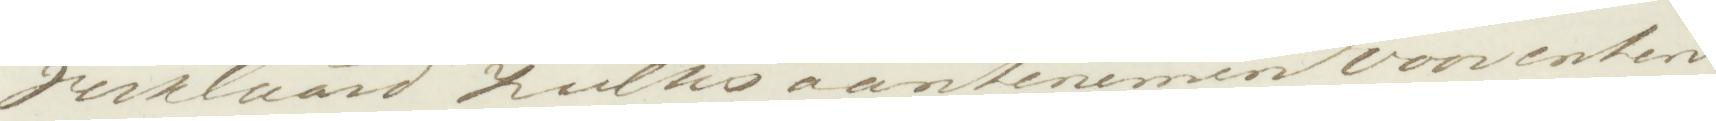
verklaard zulks aantenemen voor enten
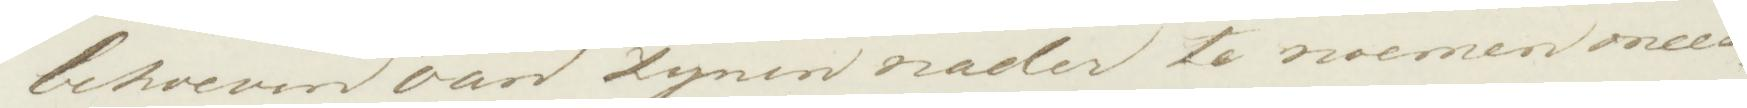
behoeven van zynen nader te noemen mees
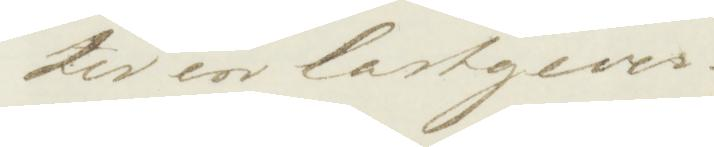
ter en lastgever.
